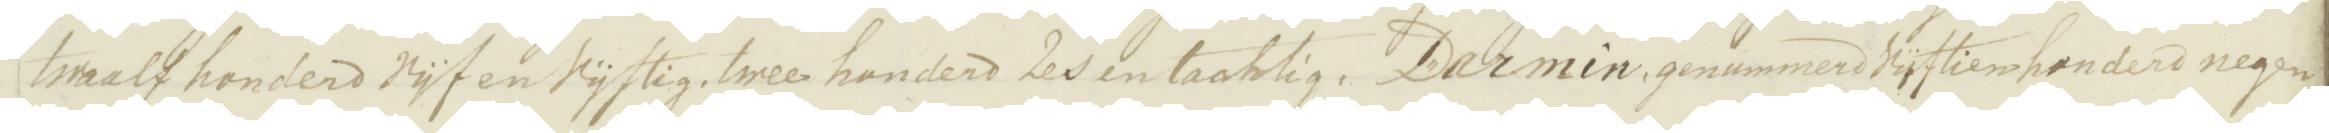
twaalf honderd vijf en vijftig, twee honderd zes en tachtig, Darmin, genummerd vijftien honderd negen
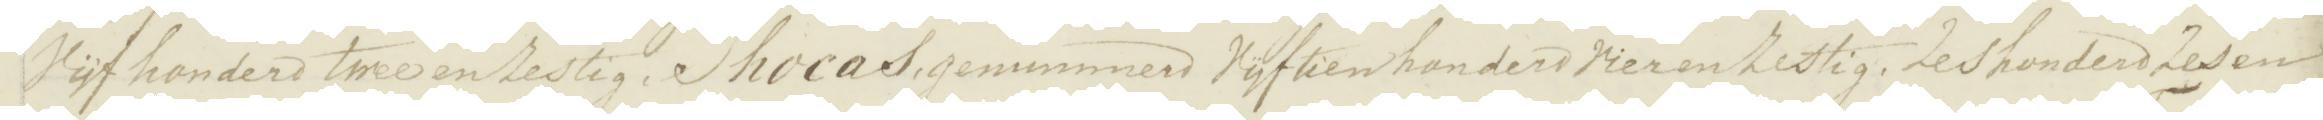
Vijf honderd twee en zestig, Phocas, genummerd vijftien honderd vier en zestig, zes honderd zes en
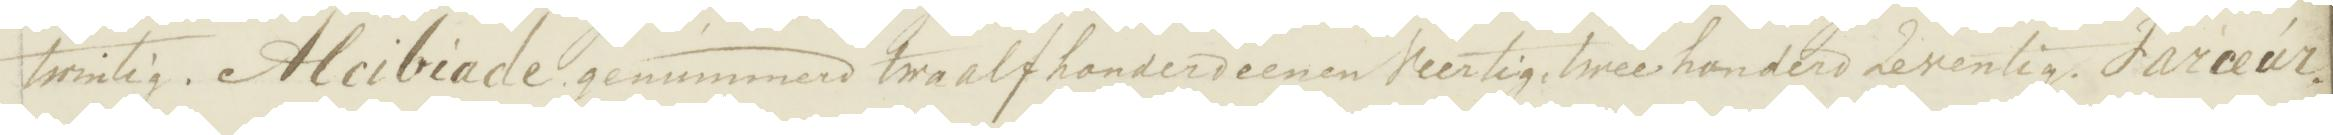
twintig. Alcibiade, genummerd twaalf honderd een en Veertig, twee honderd zeventig. Farceur,
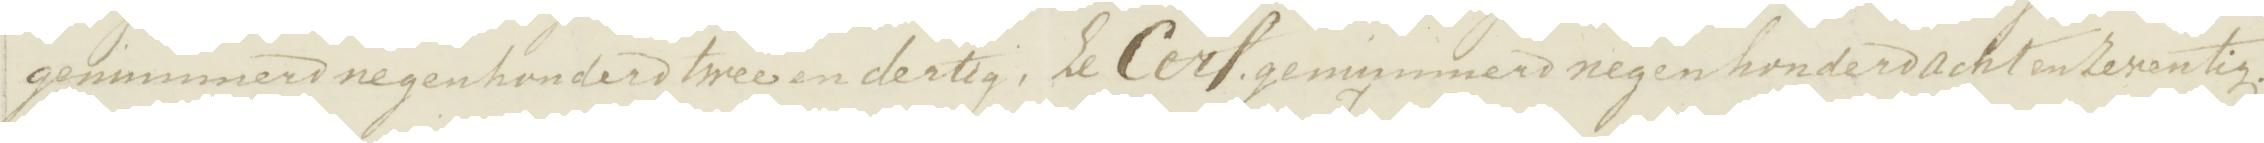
genummerd negenhonderd twee en dertig, Le Cerf, genummerd negen honderd acht en zeventig.
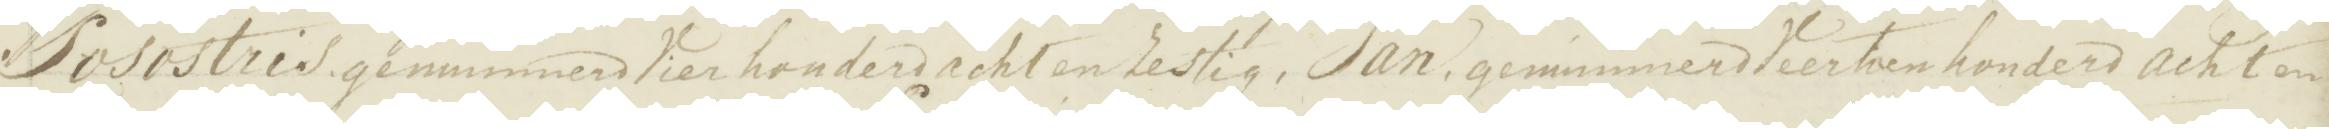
Sosostris, genummerd Vier honderd acht en zestig, Ian, genummerd Veertien honderd acht en
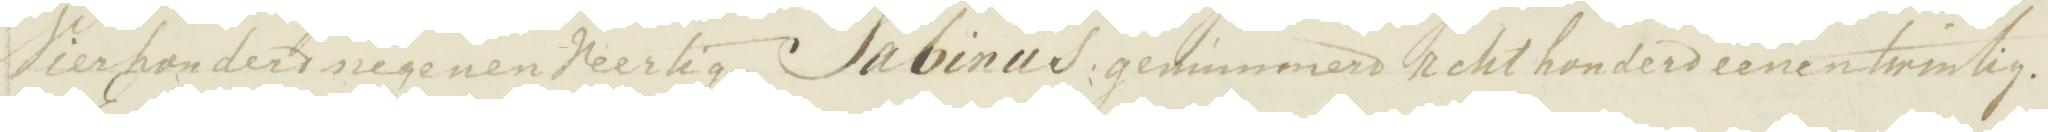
Vierhonderd negenen Veertig, Sabinus, genummerd acht honderd eenen twintig.
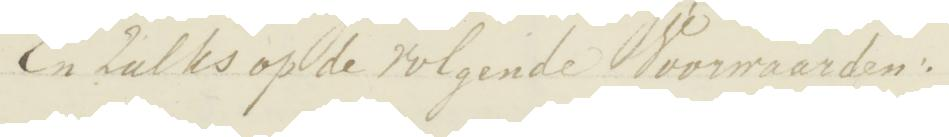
En zulks op de volgende Voorwaarden:
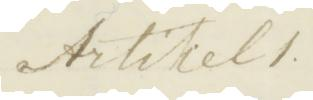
Artikel 1.
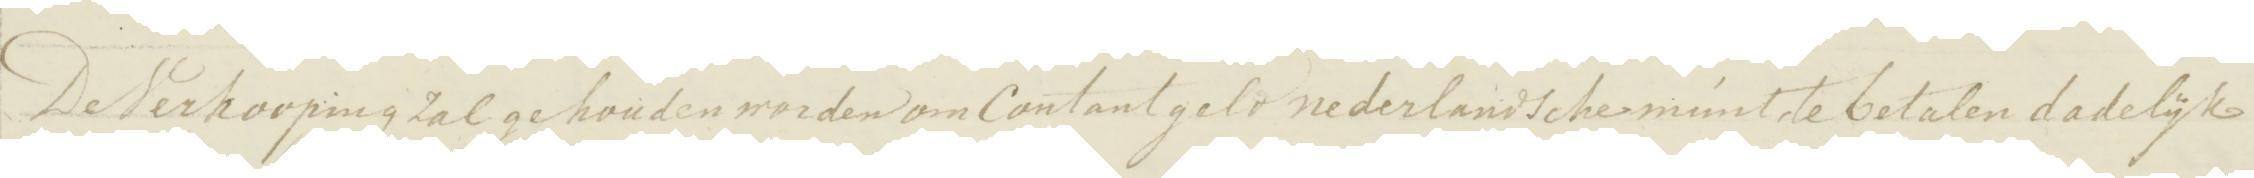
De Verkooping zal gehouden worden om contant geld nederlandsche munt te betalen dadelijk
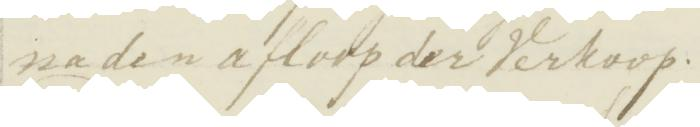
na den afloop der Verkoop.
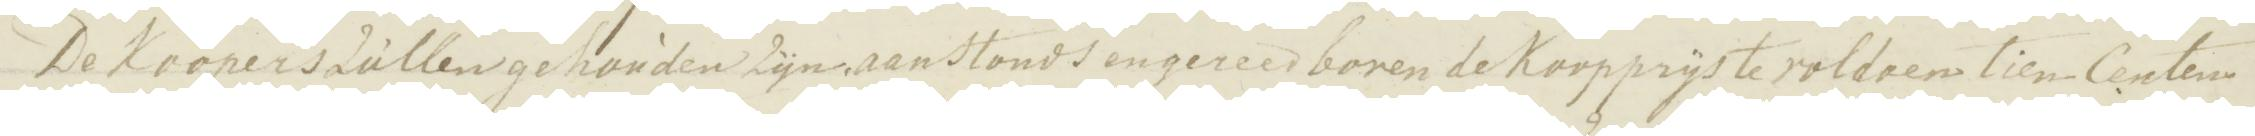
De Koopers zullen gehouden zijn, aanstonds en gereed boven de Koopprijs te voldoen tien Centen
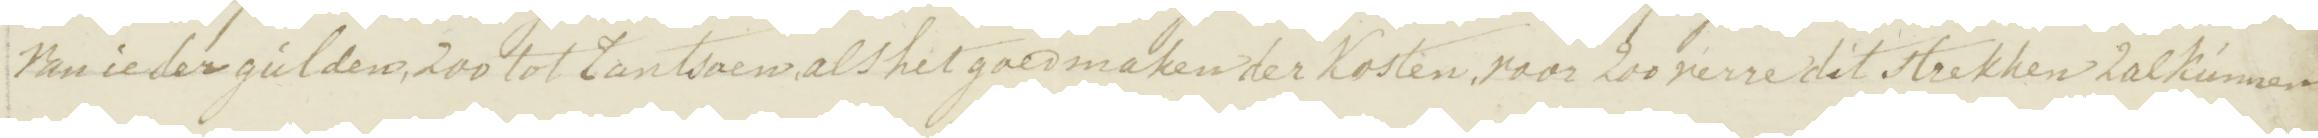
van ieder gulden, zoo tot rantsoen, als het goedmaken der Kosten, voor zoo verre dit strekken zal kunnen
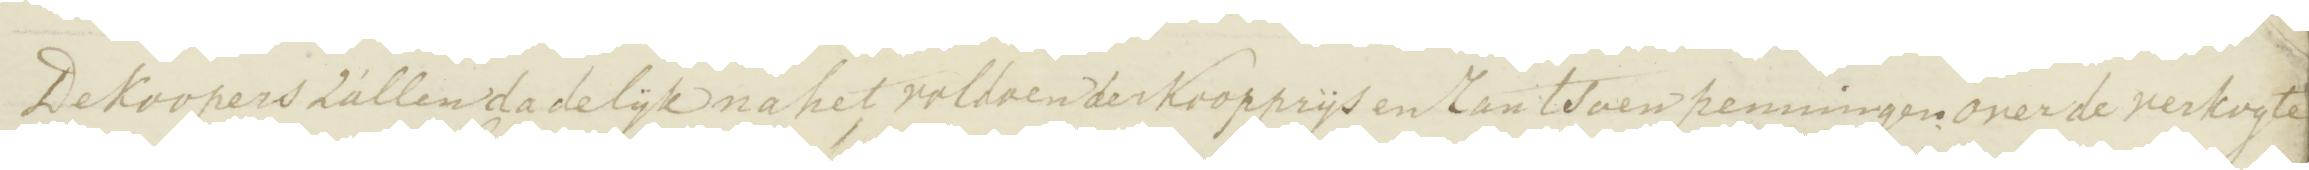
De koopers zullen dadelijk na het voldoen der koopprijs en rantsoen penningen over de verkogte
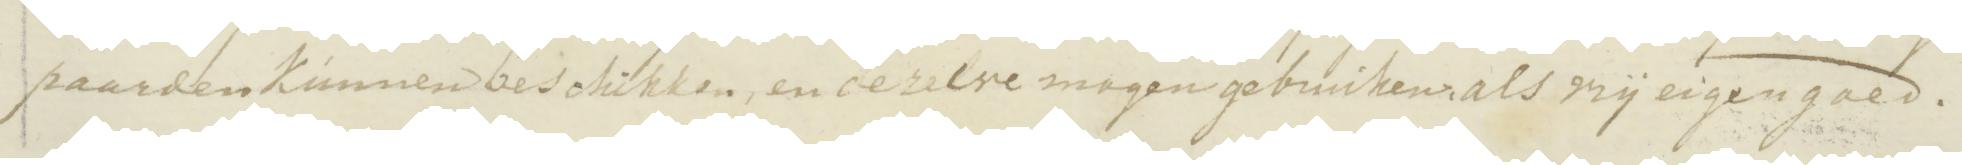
paarden kunnen beschikken, en dezelve mogen gebuiken, als vrij eigen goed.
